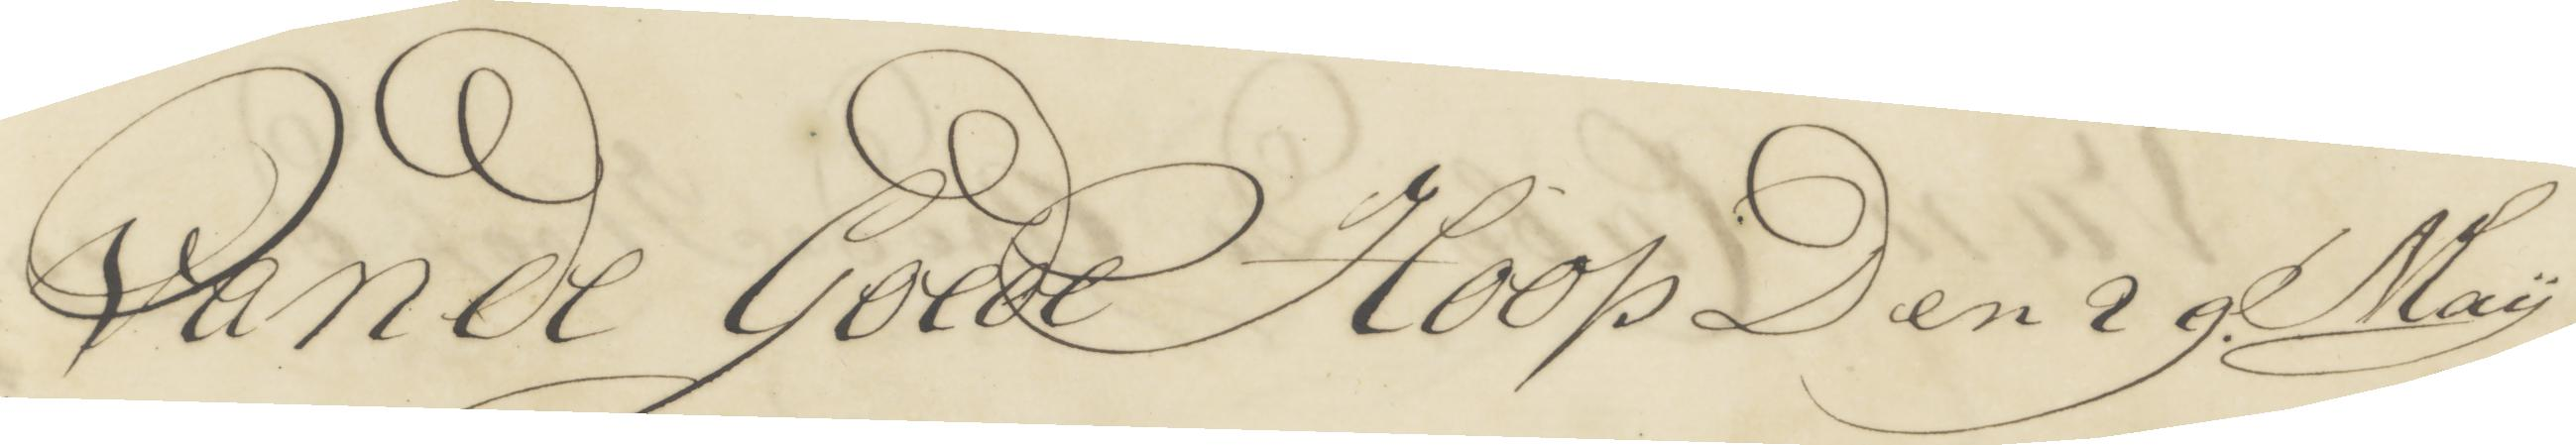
Van de Goede Hoop Den 29.' Maij
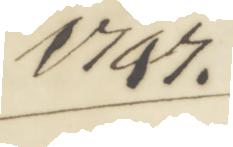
1747.
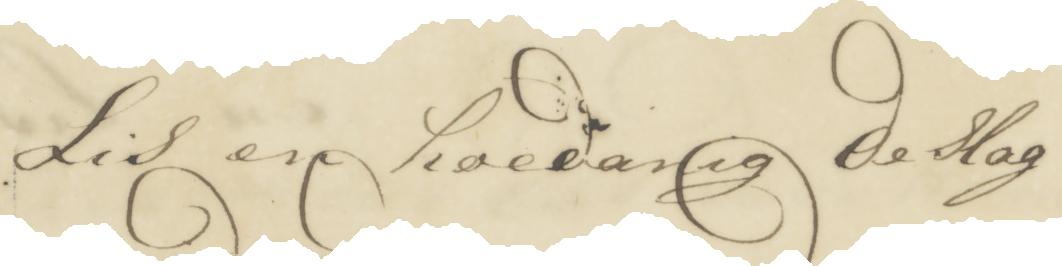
Lis en hoedanig de slag
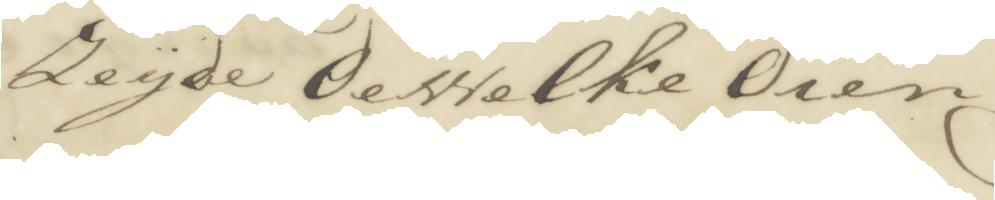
zeijde dewelke dien
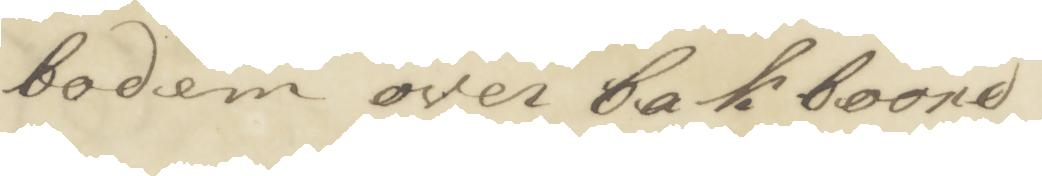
bodem over bakboord
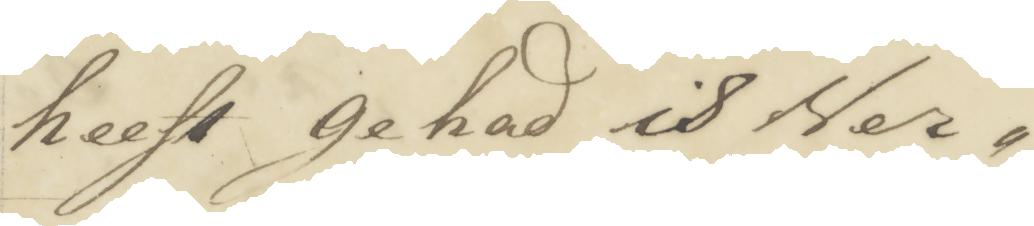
heeft gehad is ver„
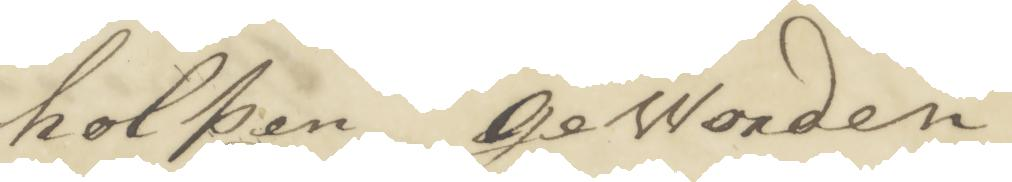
holpen geworden
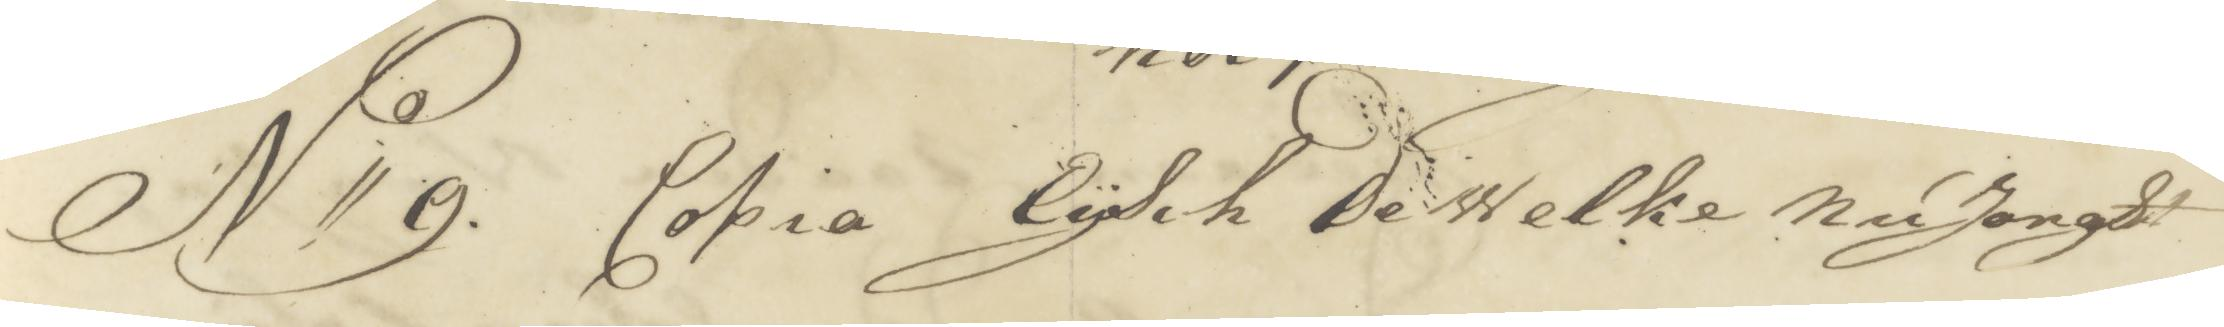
N„o 9. Copia Eijsch de welke nu Jongst
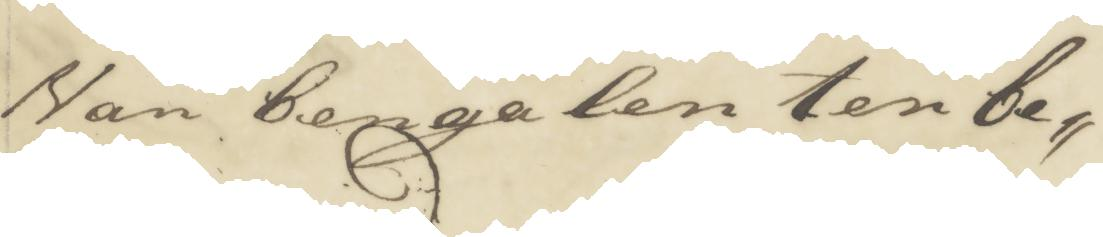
van bengalen ten be„
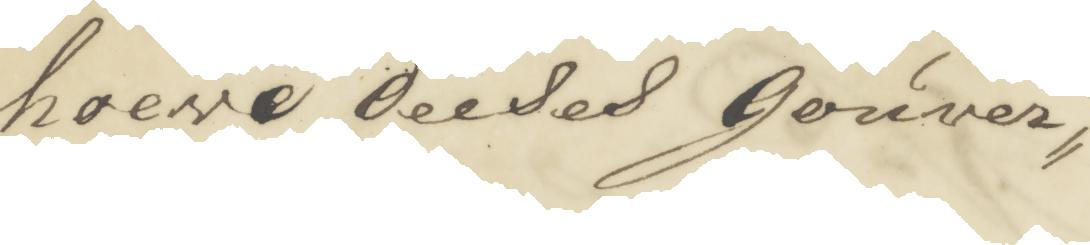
hoeve deeses gouver„
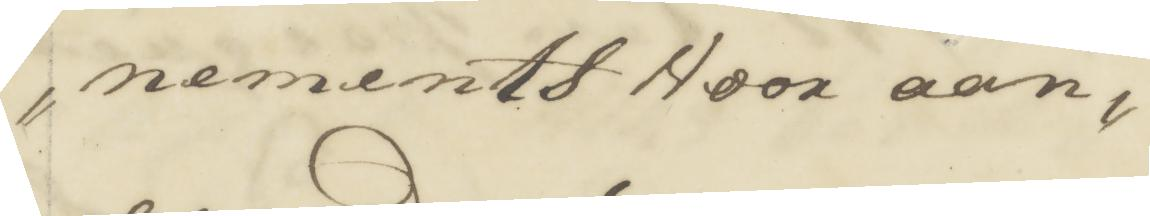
„nements voor aan„
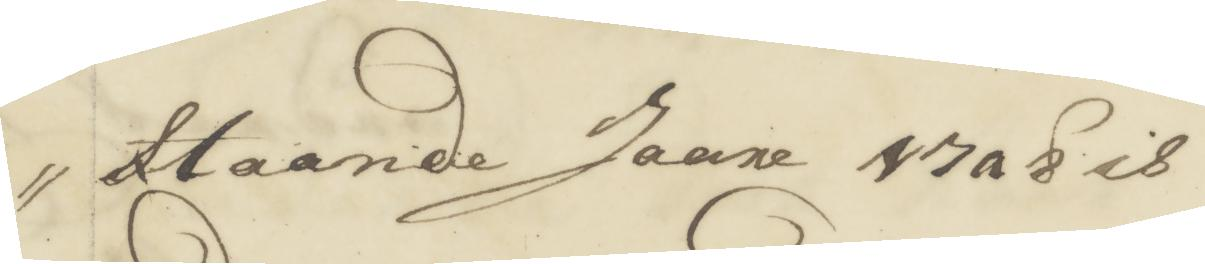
„staande Jaare 1748 is
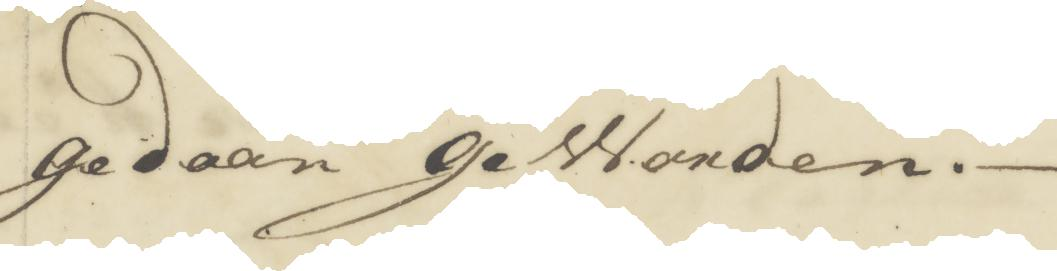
gedaan geworden. —
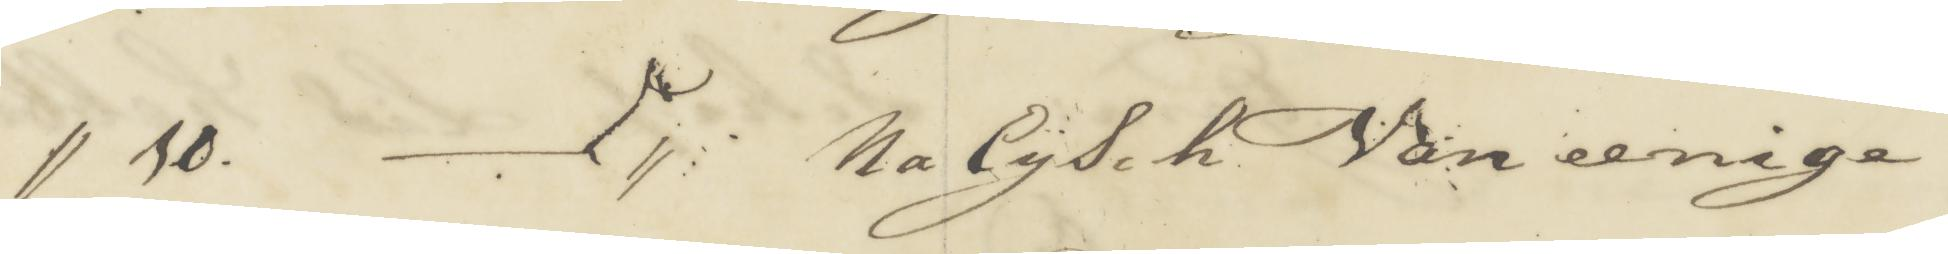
„ 10. _„o: na Eijsch van eenige
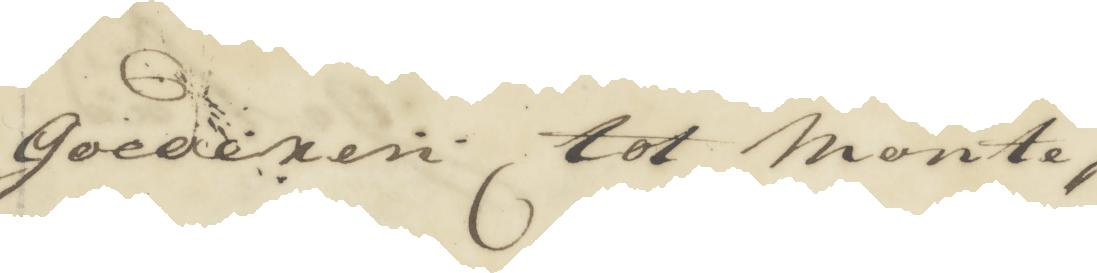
goederen tot monte
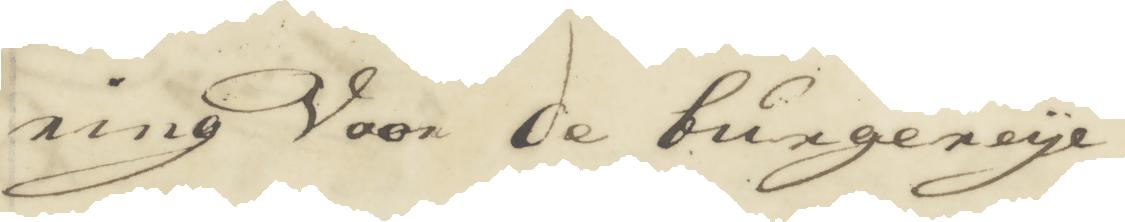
ring voor de burgereije
